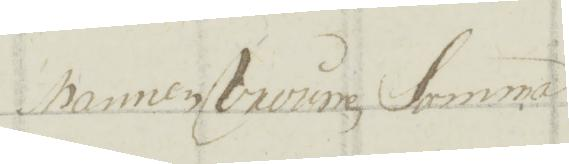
Mannen Vrouwen Somma
